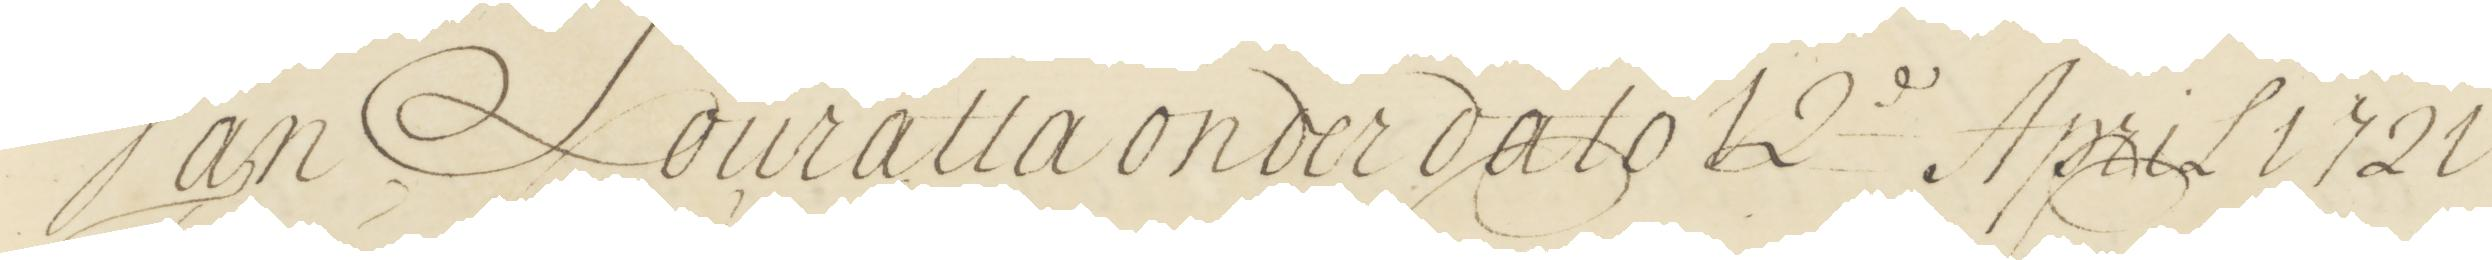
Van Souratta onder dato 12=e April 1721
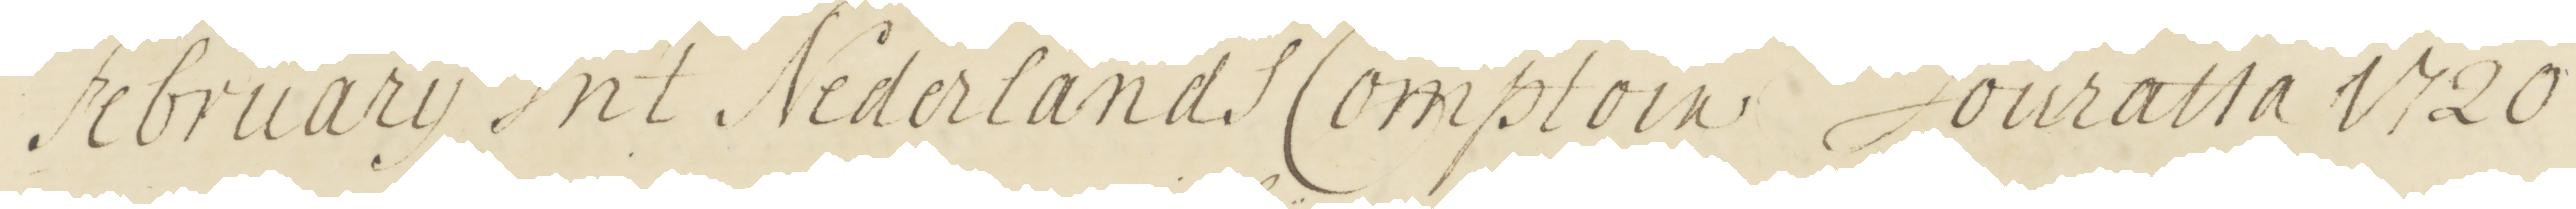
Februarij In’t Nederlands Comptoir Souratta 1720
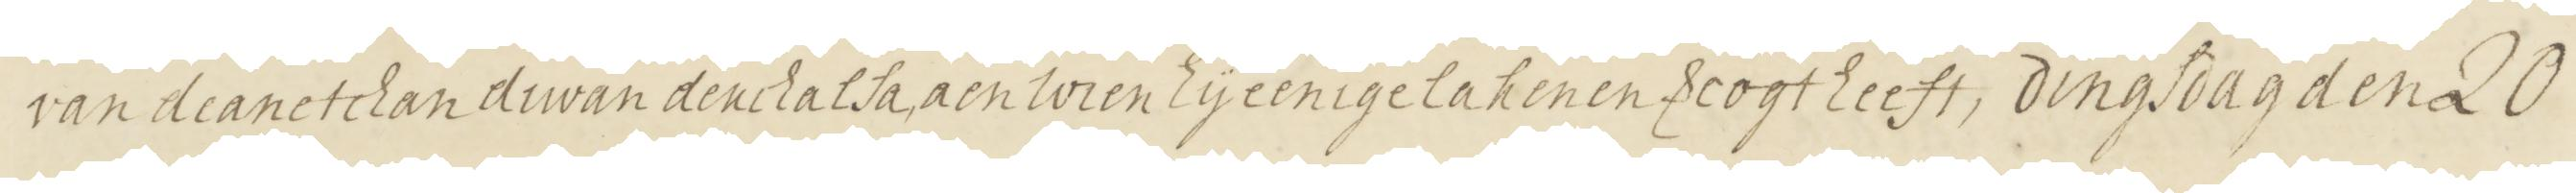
van deanetchan diwan derchalsa, aen wien hij eenige lakenen vercogt heeft, dingsdag den 20
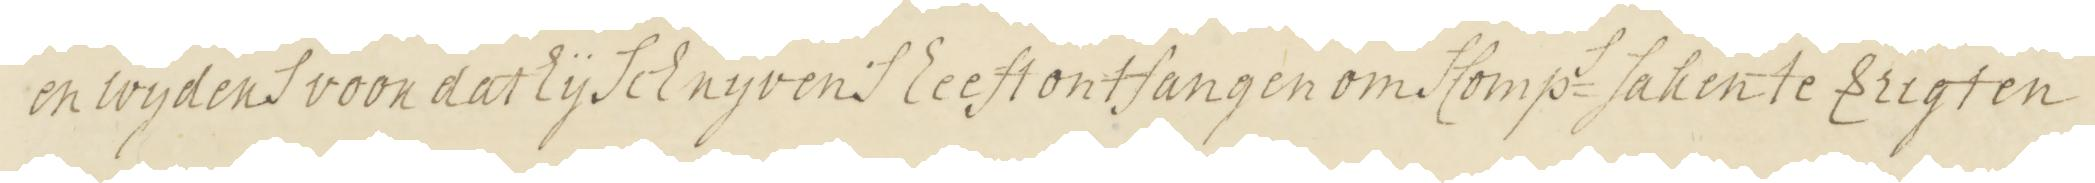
en wijders voor dat hij schrijvens heeft ontfangen om sComp=s saken te verrigten
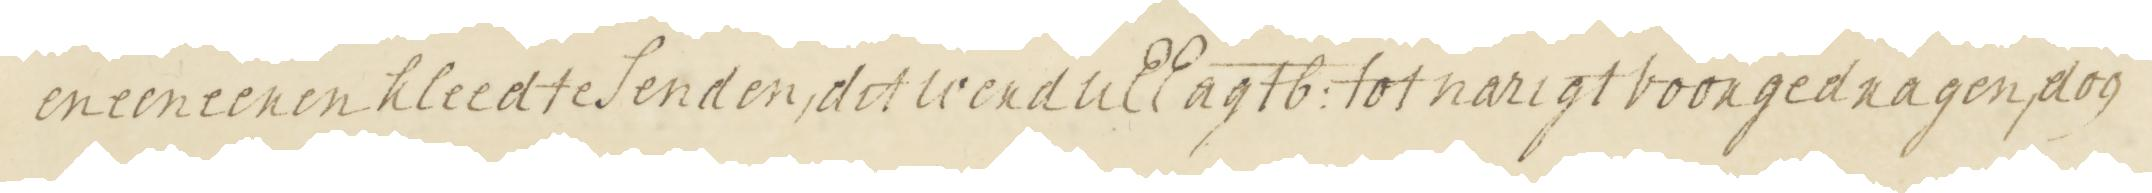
en een eeren kleedtesenden, dit werd uEE agtb: tot narigt voor gedragen, dog
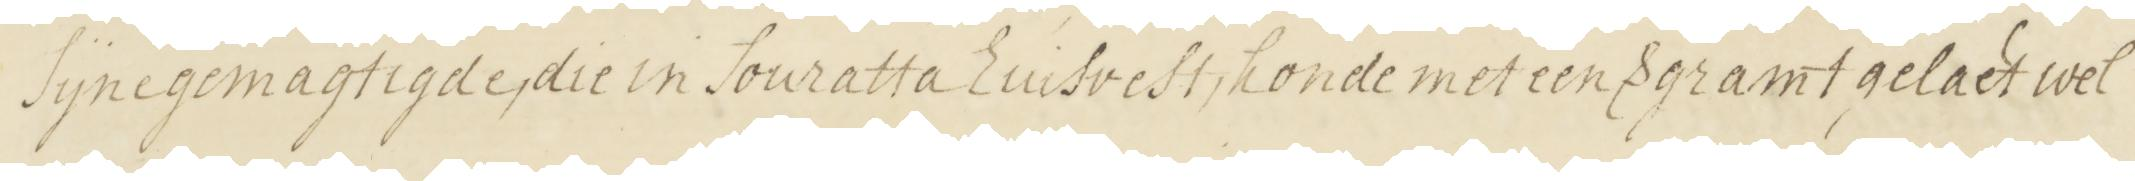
sijne gemagtigde, die in souratta huisvest, konde met een vergramt gelaet wel
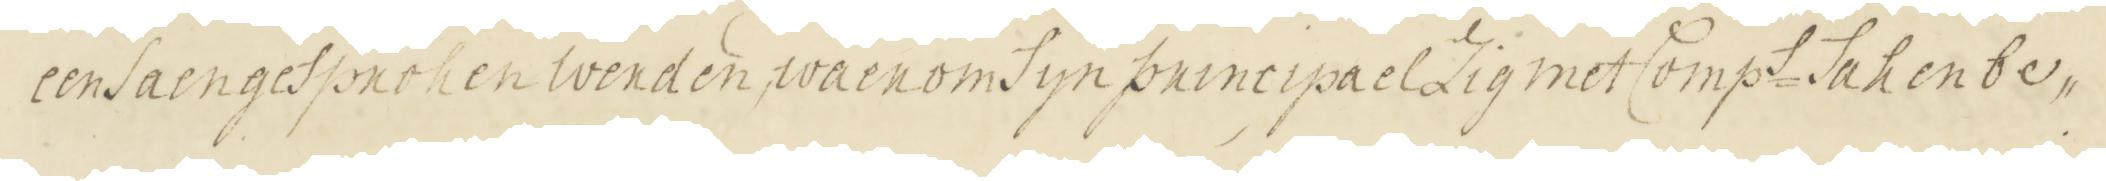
eens aengesproken werden, waer om sijn principael zig met Comp=s saken be„
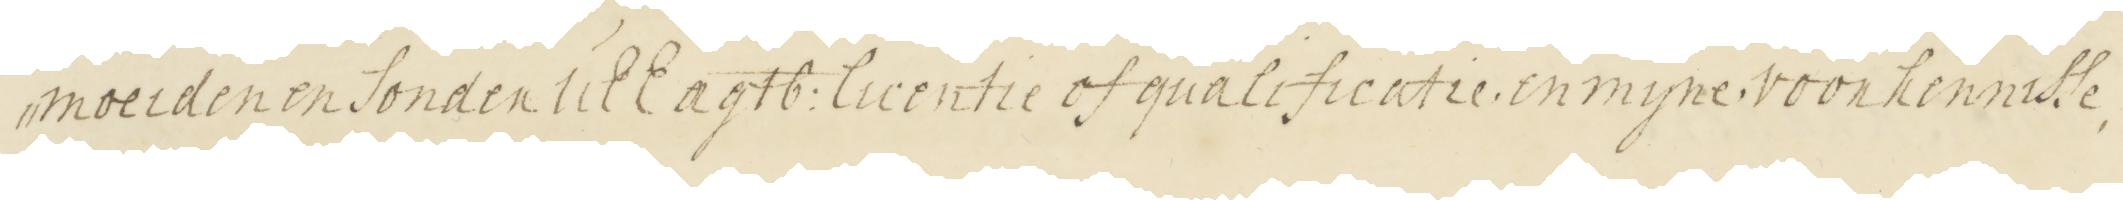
„moeiden en sonder UEE agtb: licentie of qualificatie en mijne voorkennisse,
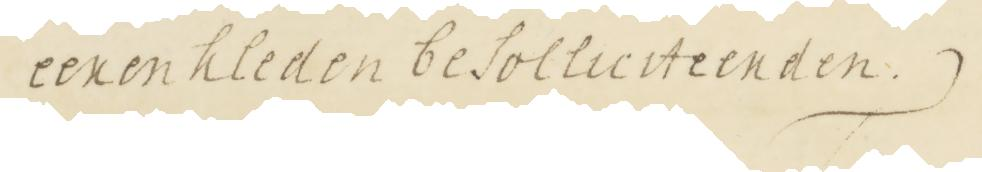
eeren kleden besolliciteerden. —
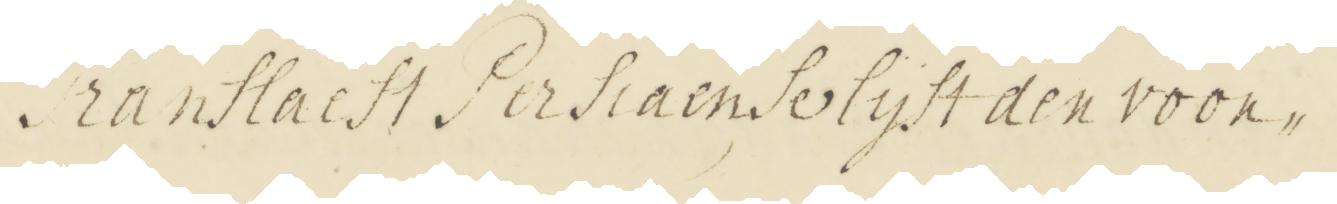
Translaest Persiaense lijst den voor„
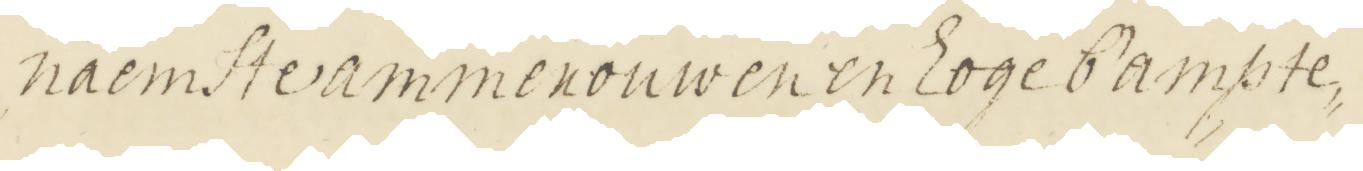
„naemste ammerouwen en hoge b'ampte„
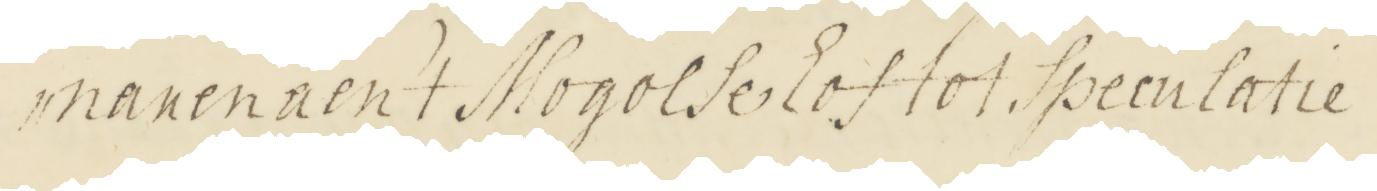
„naren aen ’t Mogolse hof tot speculatie
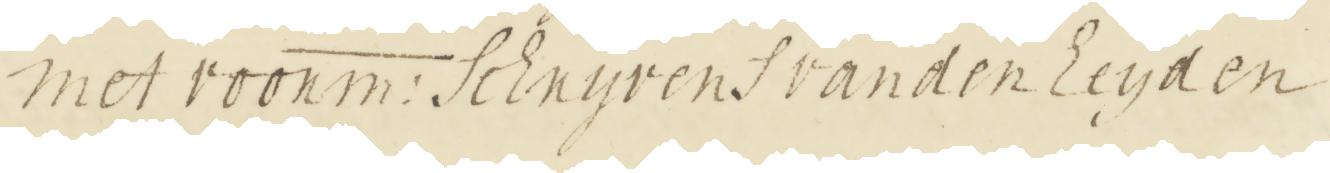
met voorm: schryvens van den heijden
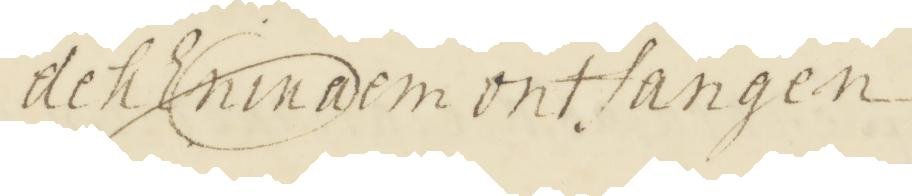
dekhniraem ontfangen
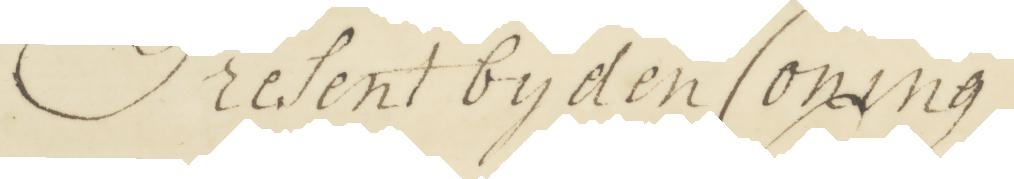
Present bij den Coning
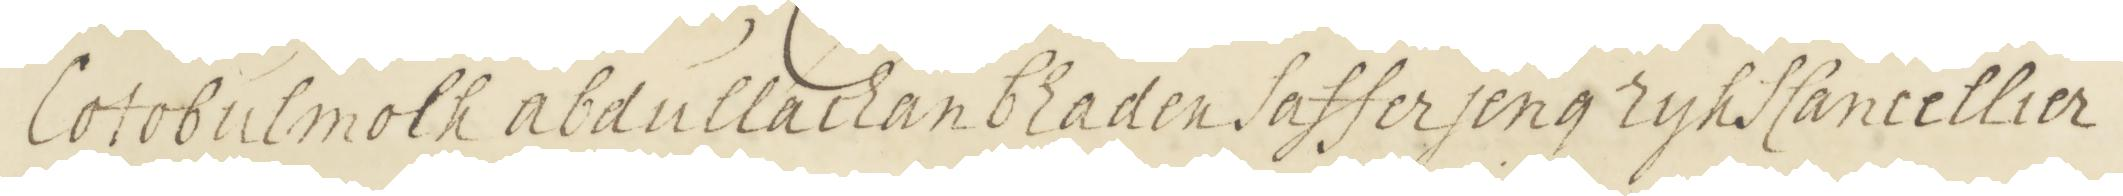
Cotobulmolk aldullachan bhader sasserjeng rykscancellier
